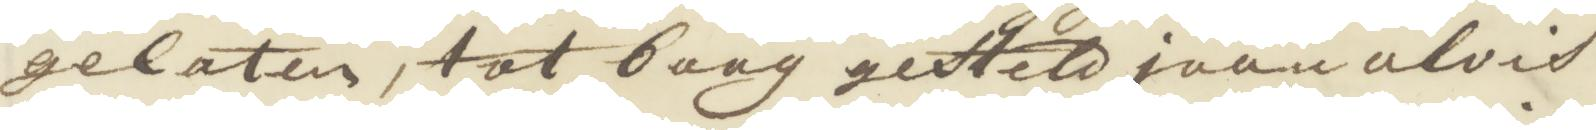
gelaten, tot borg gesteld joan alvis
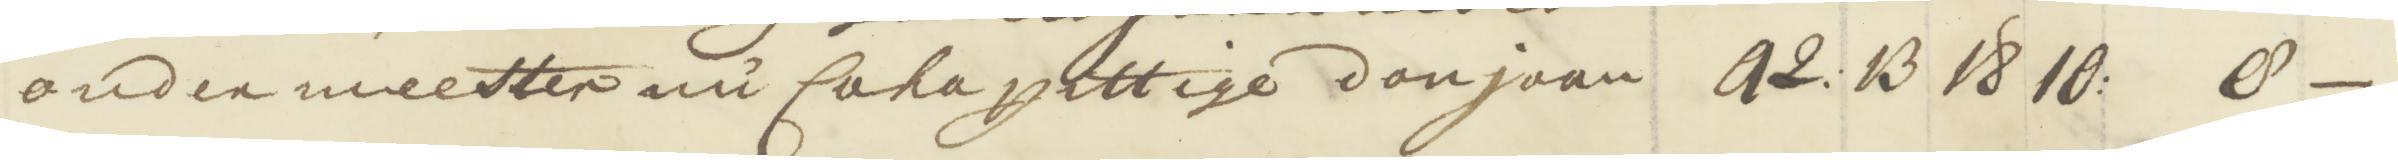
onder meester nu Cakapittige don joan 42. 13 18 10: 8 —
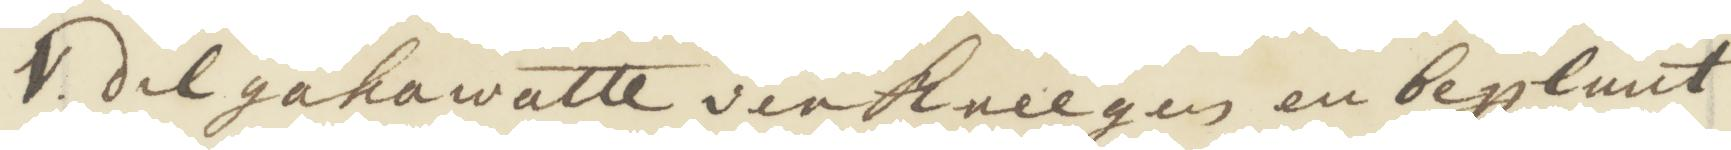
1. dil gakawatte verkreegen en beplant
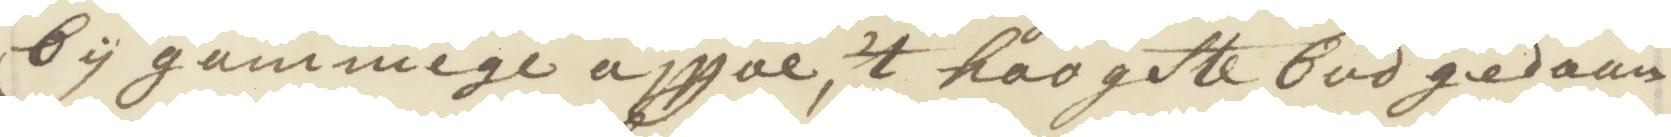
bij gammege appoe, ’t hoogste bod gedaan
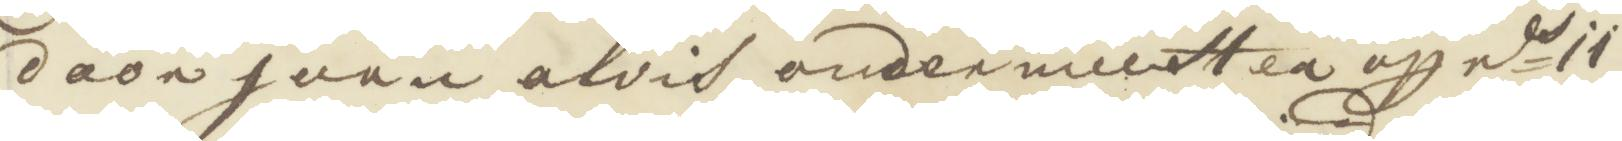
door joan alvis ondermeester op rd=s 11
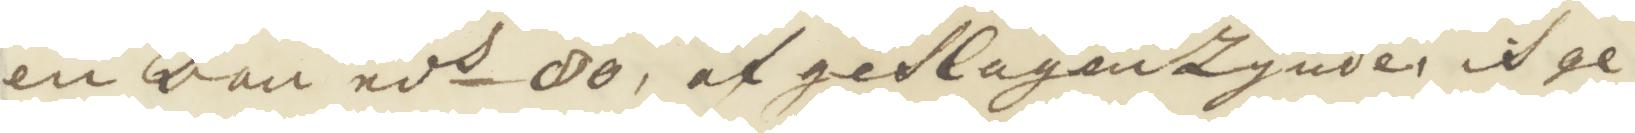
en van rd=s 80, af geslagen Zijnde, is ge
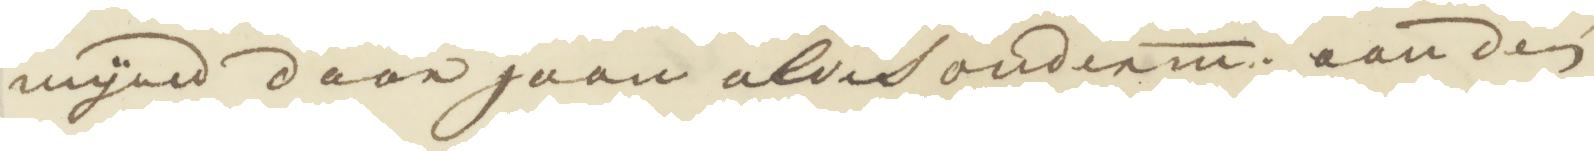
mijnd door joan alvis onderm: aan den
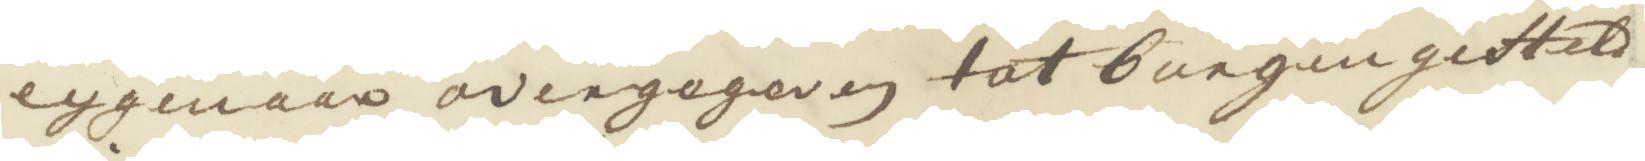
eygenaar overgegeven tot burgen gesteld
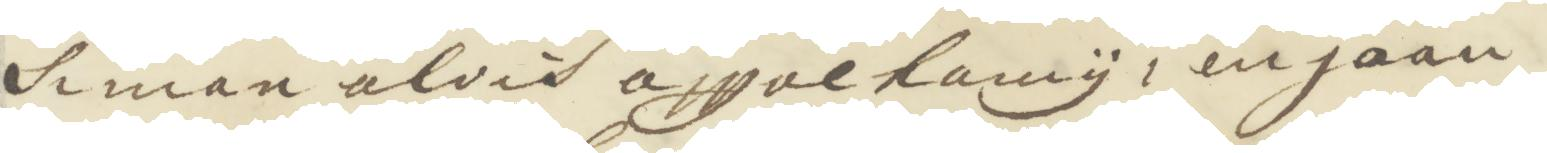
Siman alvis appol kamij, en joan
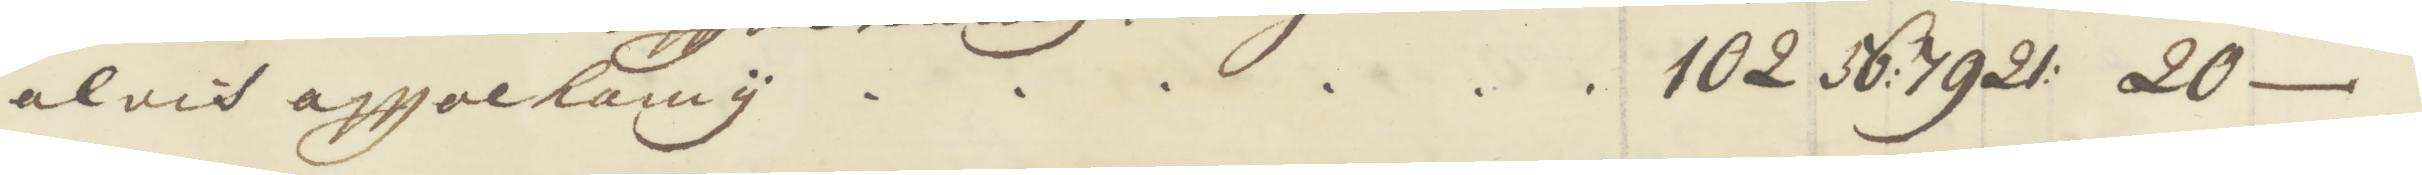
alvis appolhamij . . . . . . 102 36: 7921: 20 —
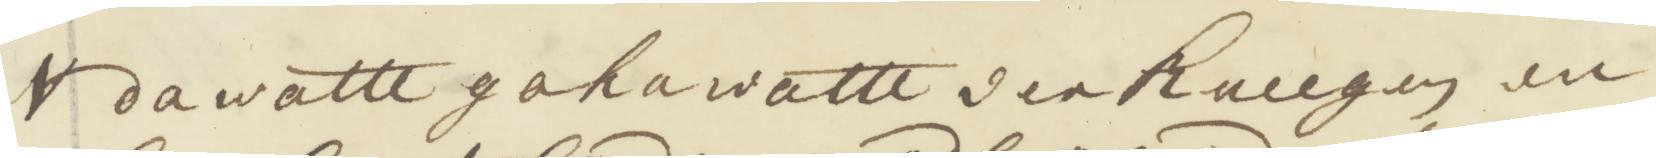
1. dawatte gakawatte verkreegen en
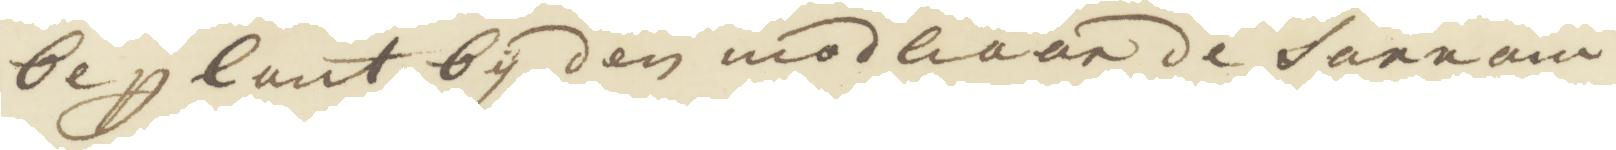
beplant bij den modhaar de Sarram
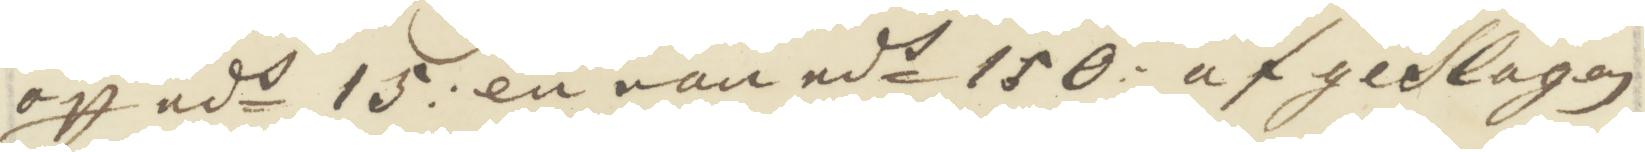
op rd=s 15: en van rd=s 150: af geslagen
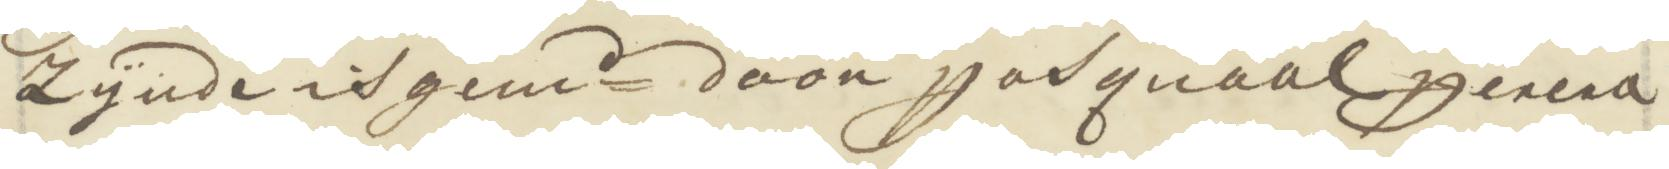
Zijnde is gem=d door pasquaal perera
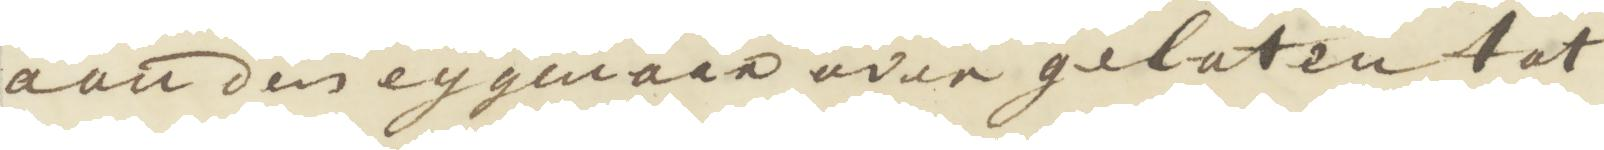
aan den eygenaar over gelaten tot
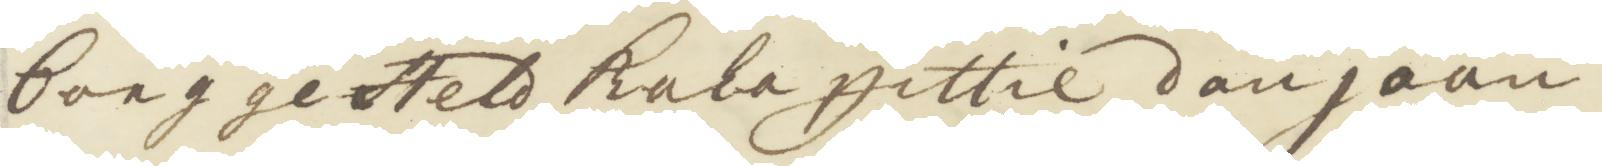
borg gesteld Kahapittie don joan
